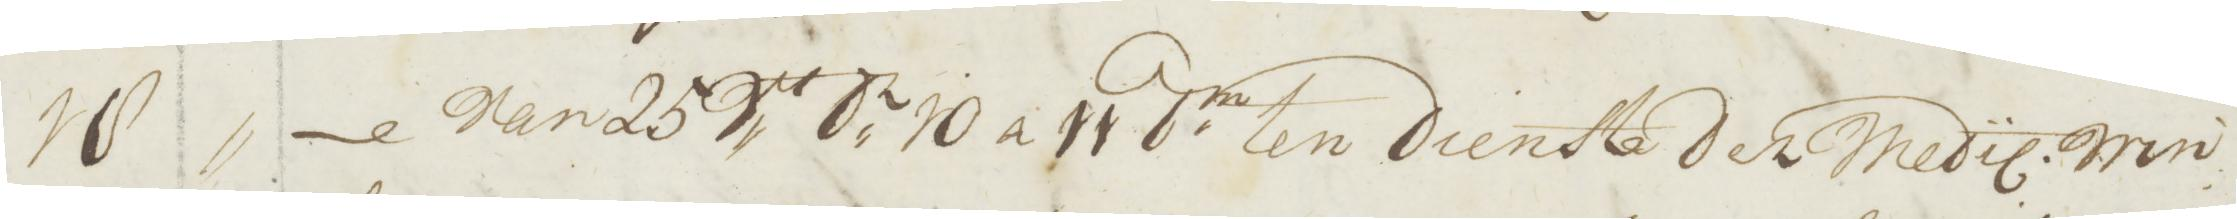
18„ _o van 25 v„t d„k 10 a 11 d„m ten dienste der medic. win
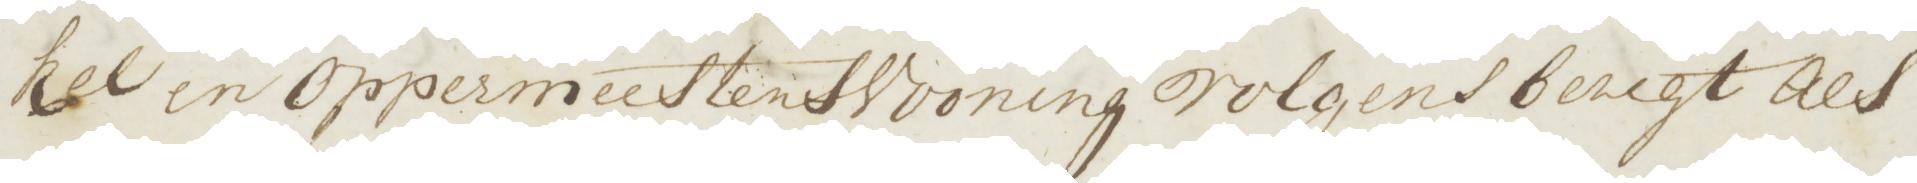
kel en oppermeesterwooning volgens berigt als
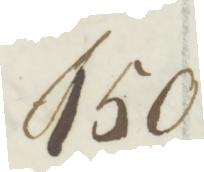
450
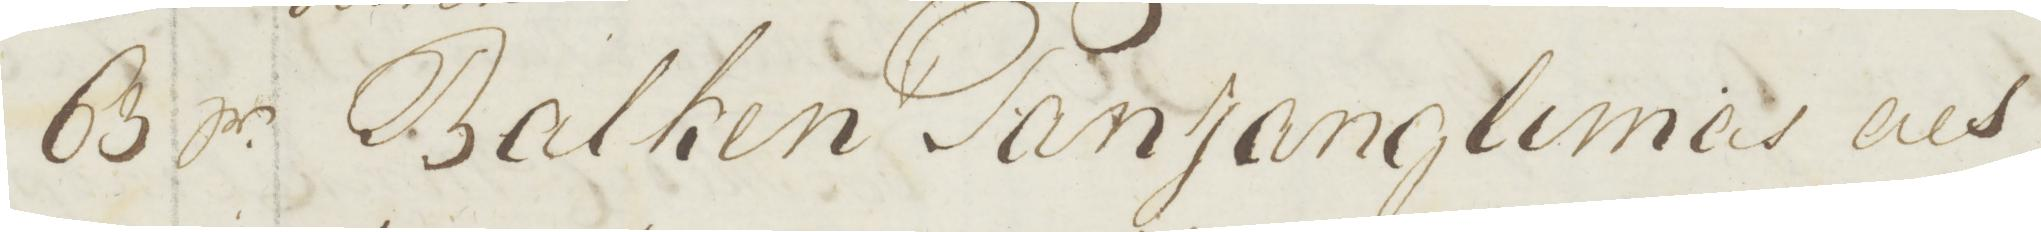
63 p.r Balken Panjanglimas als
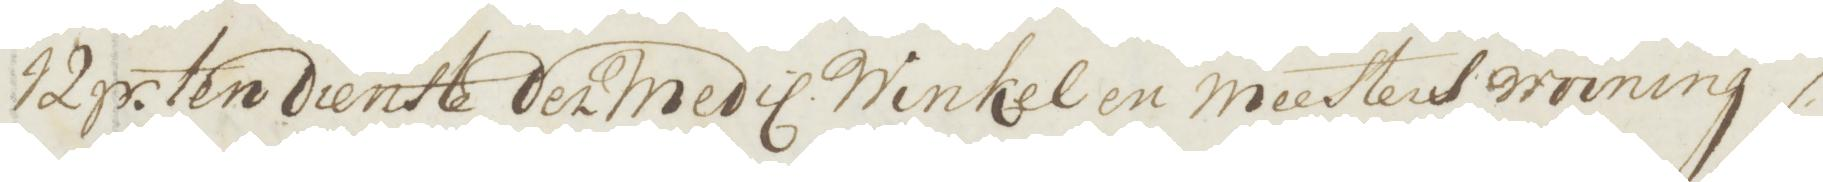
12 p.r ten dienste der medic. winkel en meesters wooning
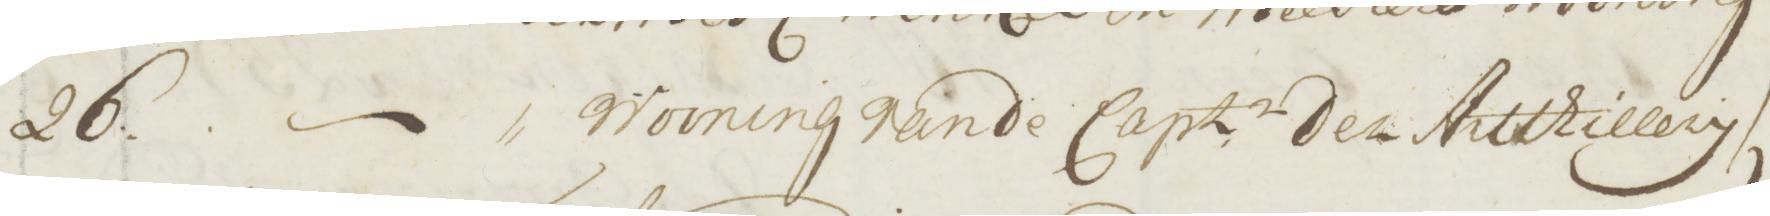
26: . — „ wooning van de Capt„n der Artthillerij
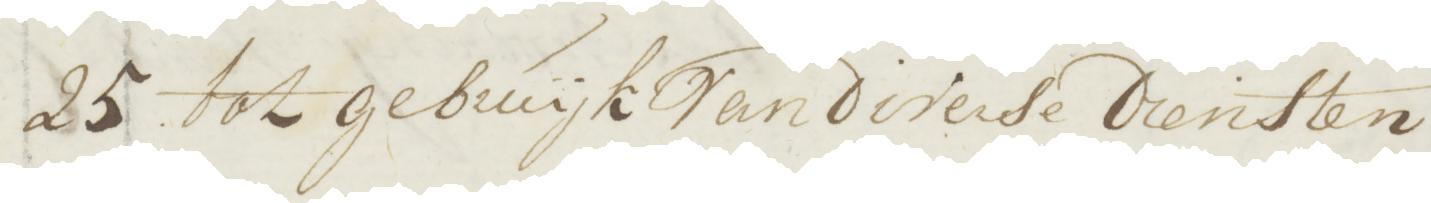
25 . tot gebruijk van diverse diensten
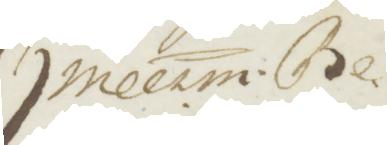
meerm. Be
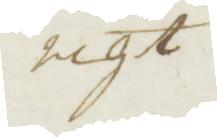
rigt
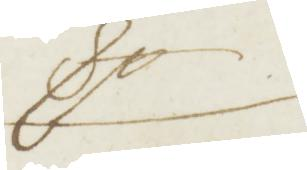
vert
